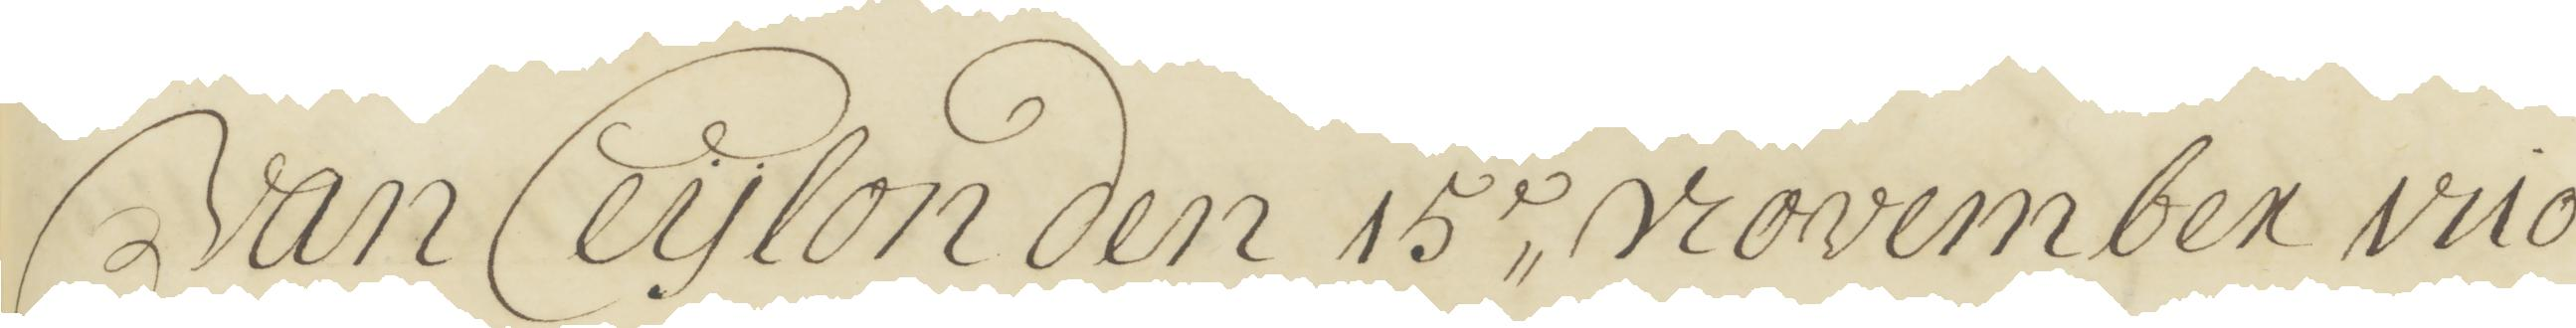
Van Ceijlon den 15„e november 1710
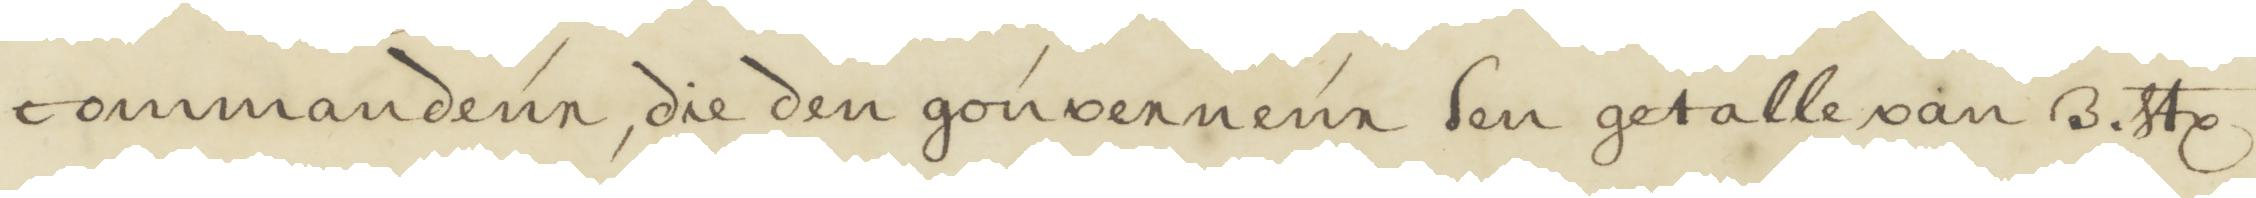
commandeur, die den gouverneur ten getalle van 3. stx
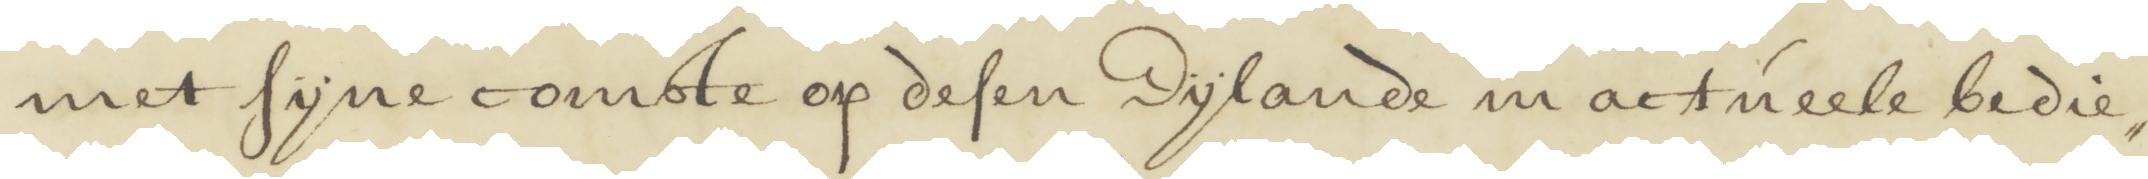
met sijne comste op desen Eijlande in actueele bedie„
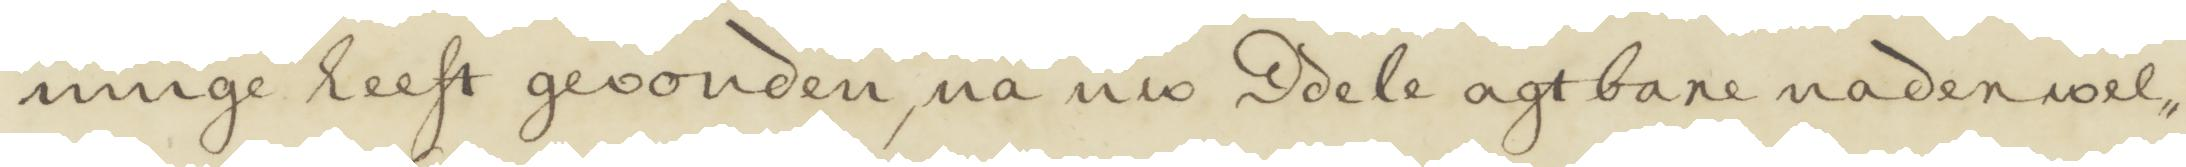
ninge heeft gevonden, na uw Edele agtbare nader wel„
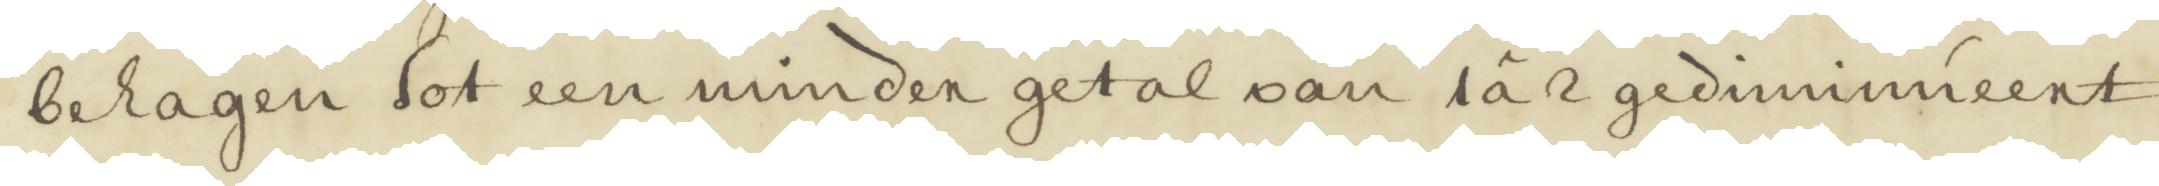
behagen tot een minder getal van 1 â 2 gediminueert
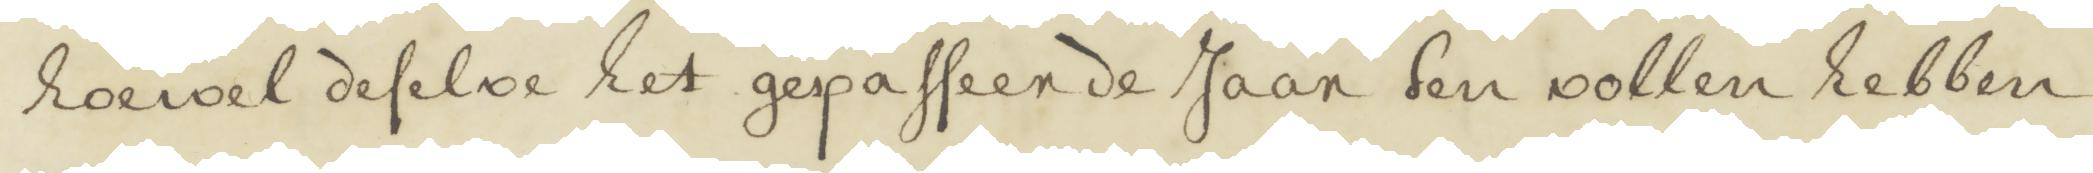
hoewel deselve het gepasseerde Jaar ten vollen hebben
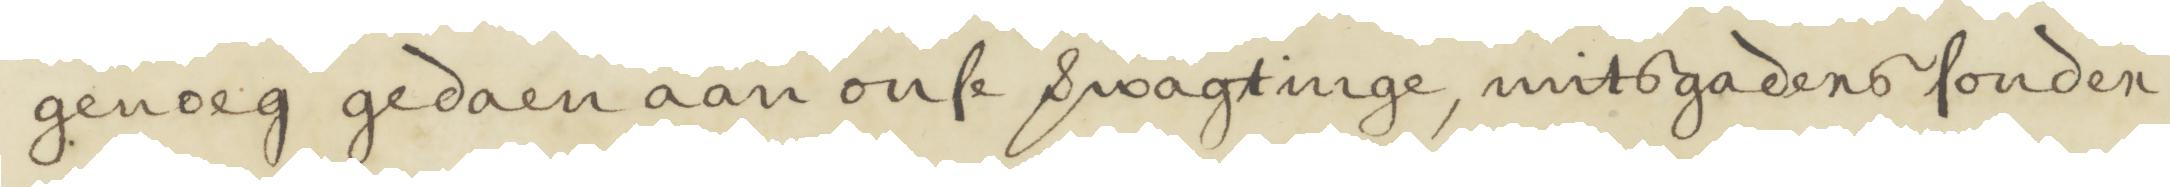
genoeg gedaen aan onse verwagtinge, mitsgaders sonder
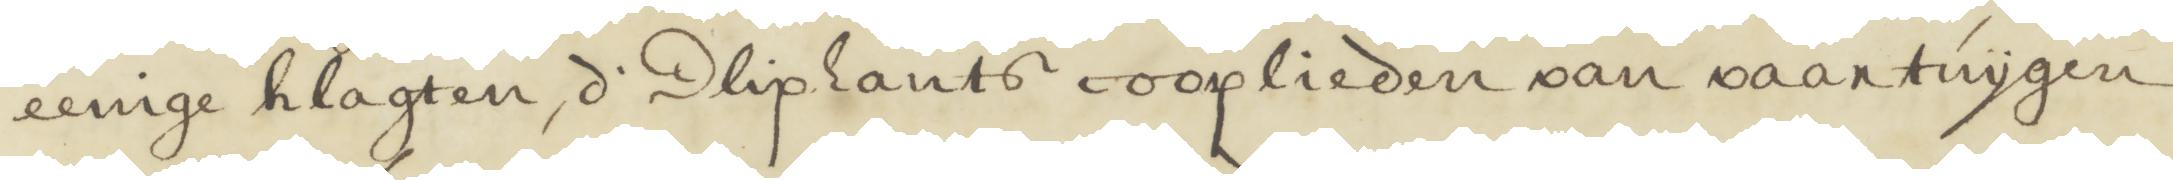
eenige klagten, d’ Eliphants cooplieden van vaartuijgen
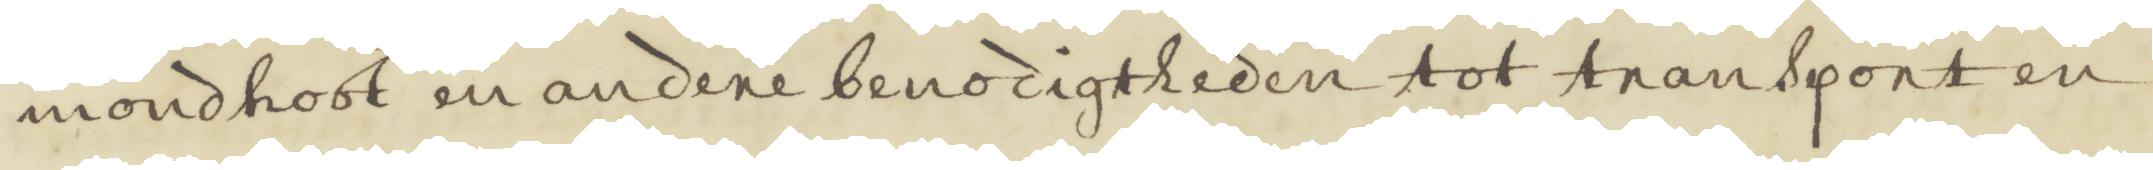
mondkost en andere benodigtheden tot transport en
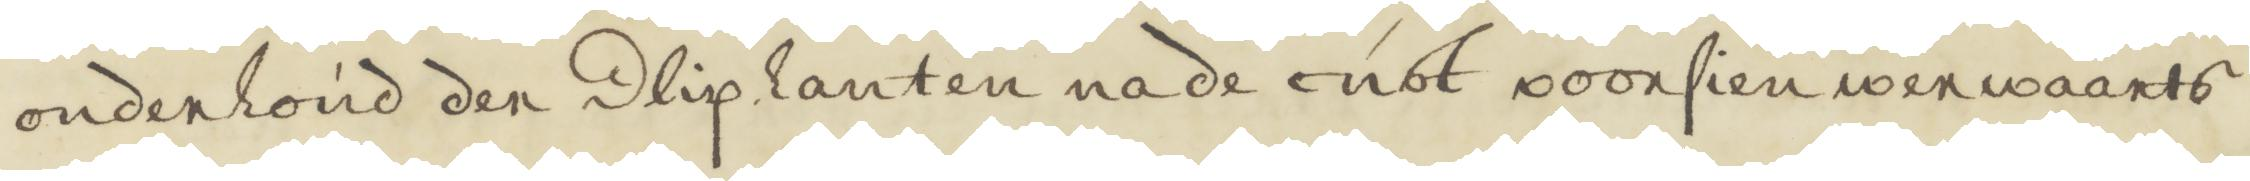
onderhoud der Eliphanten na de cust voorsien werwaarts
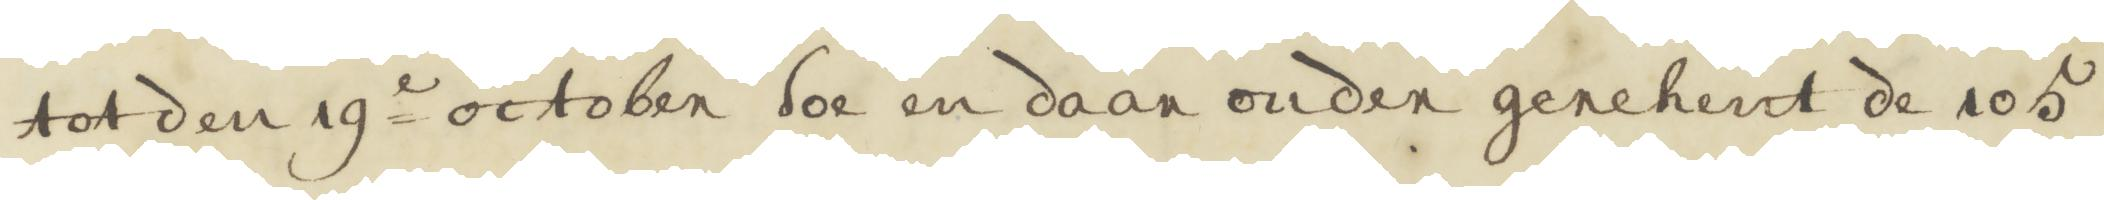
tot den 19=e october toe en daar onder gerekent de 105
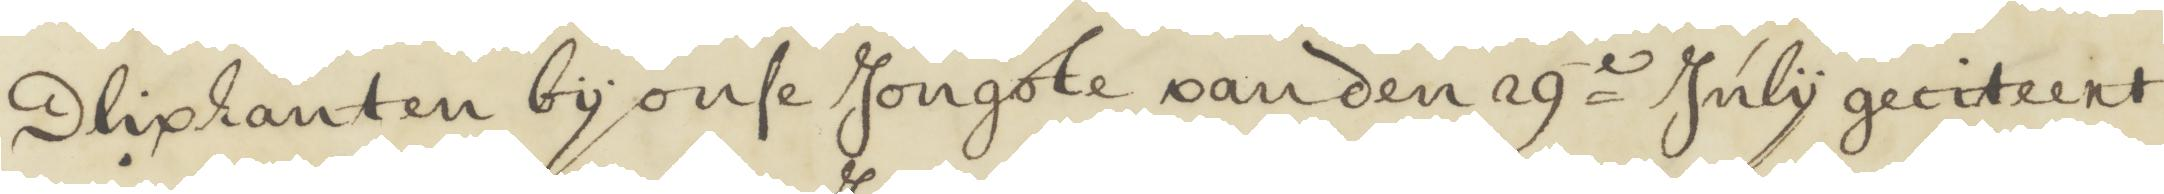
Eliphanten bij onse Jongste van den 29=e Julij geciteert
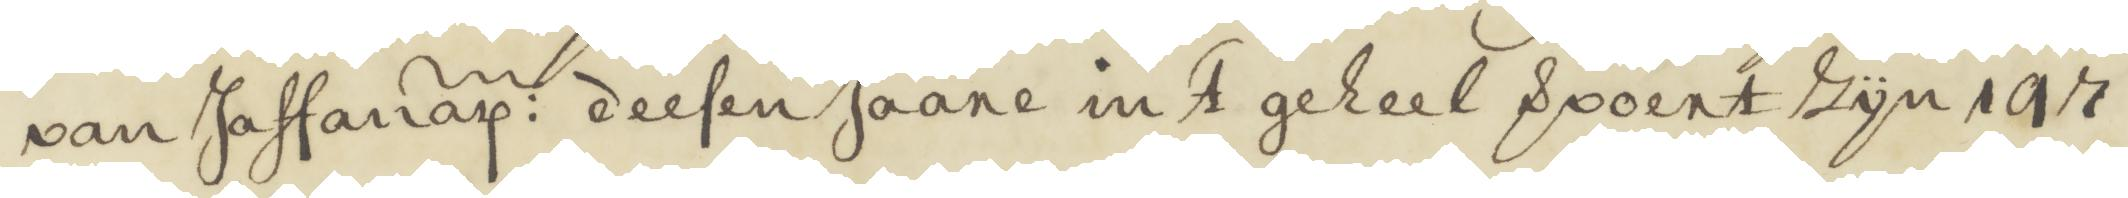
van Jaffanap:m deesen Jaare in ’t geheel vervoert zijn 147
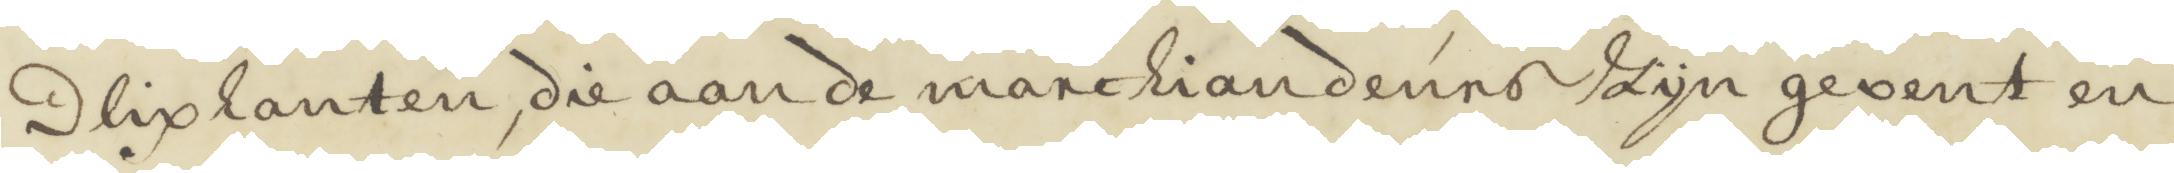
Eliphanten, die aan de marchiandeurs zijn gevent en
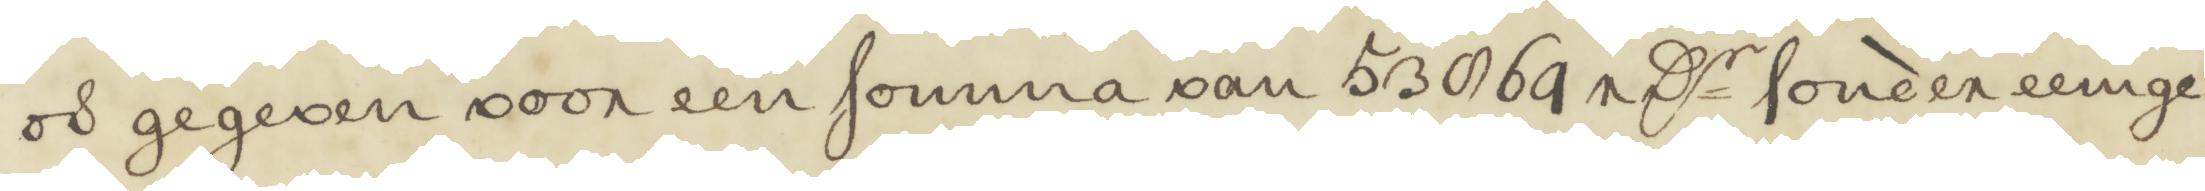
over gegeven voor een somma van 53864 rD=r sonder eenige
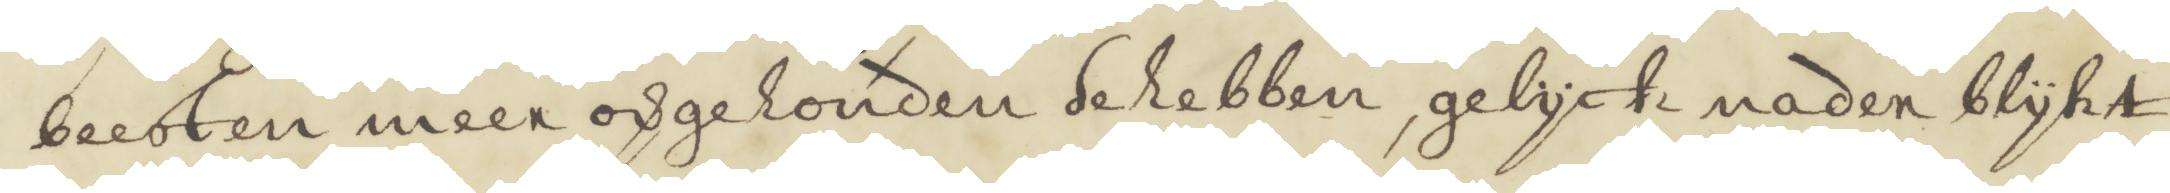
beesten meer overgehouden te hebben, gelijck nader blijkt
